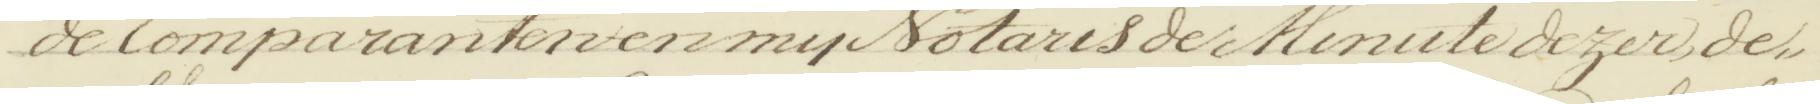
de Comparanten en my Notaris de Minute dezer, de„
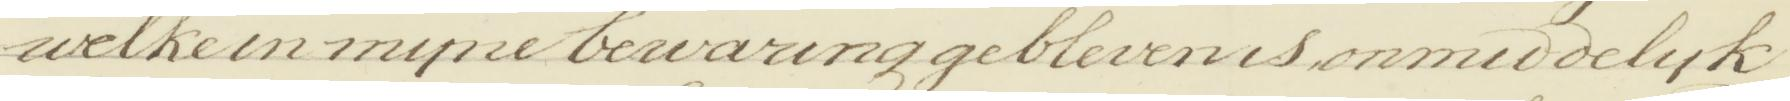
welke in myne bewaring gebleven is, onmiddelyk
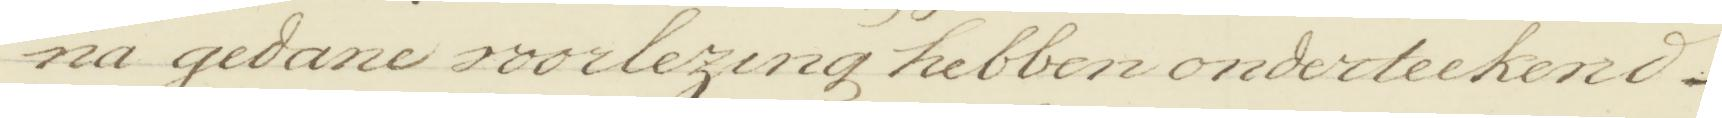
na gedane voorlezing hebben onderteekend-
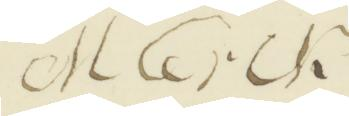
J M Erck
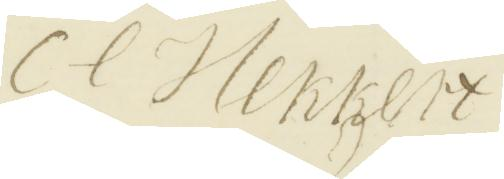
Cl Hekkert
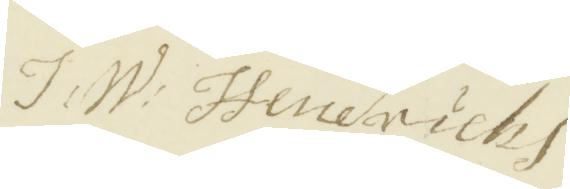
I: W: Henerichs
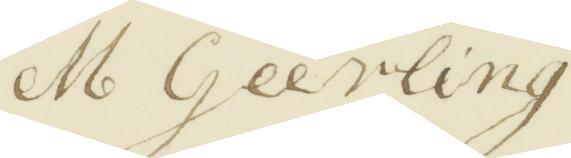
M Geerling
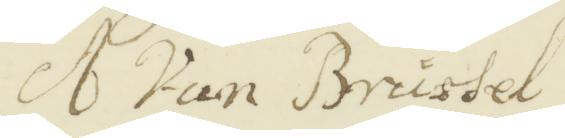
A Van Brussel
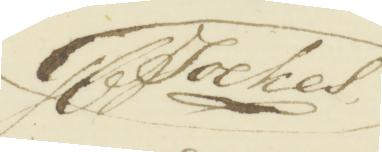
GC Joekes
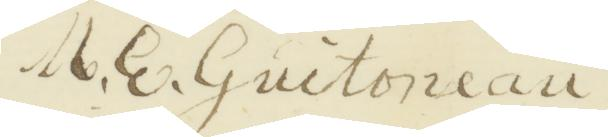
M. E. Guitoneau
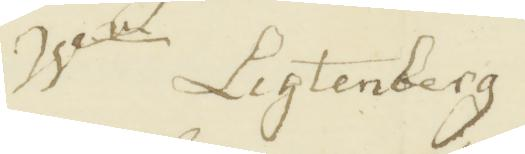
W-m Ligtenberg
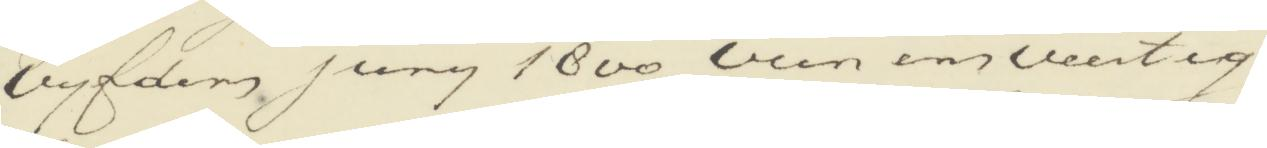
vyfden Juny 1800 vier en veertig
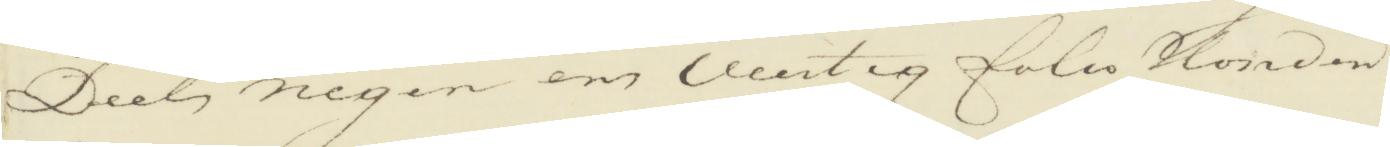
Deel negen en veertig folio Honderd
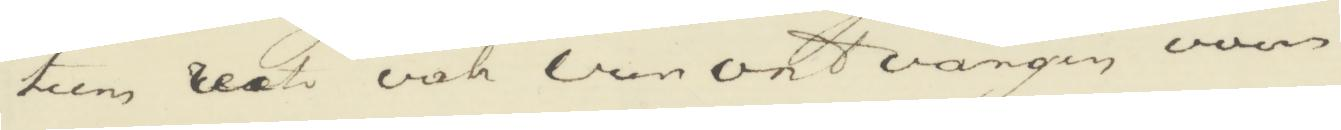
tien recto vak vier ontvangen voor
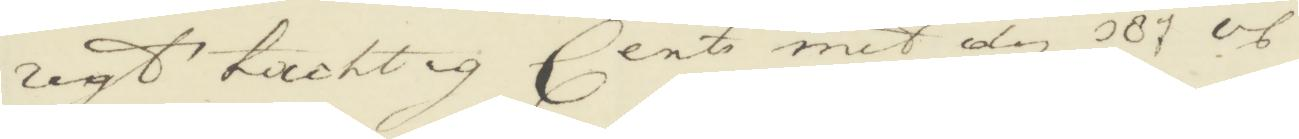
regt tachtig Cents met den 28½ oc
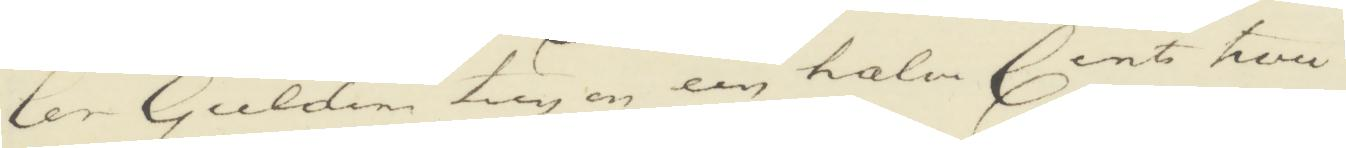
Een Gulden tien en een halve Cents twee
